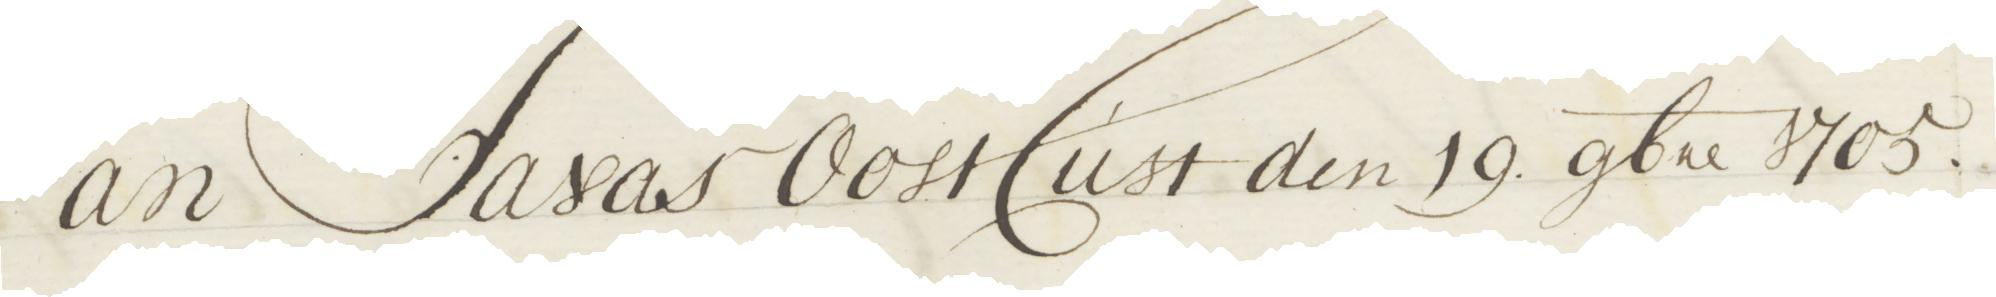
Van Javas Oost Cust den 19. 9bre 1705.
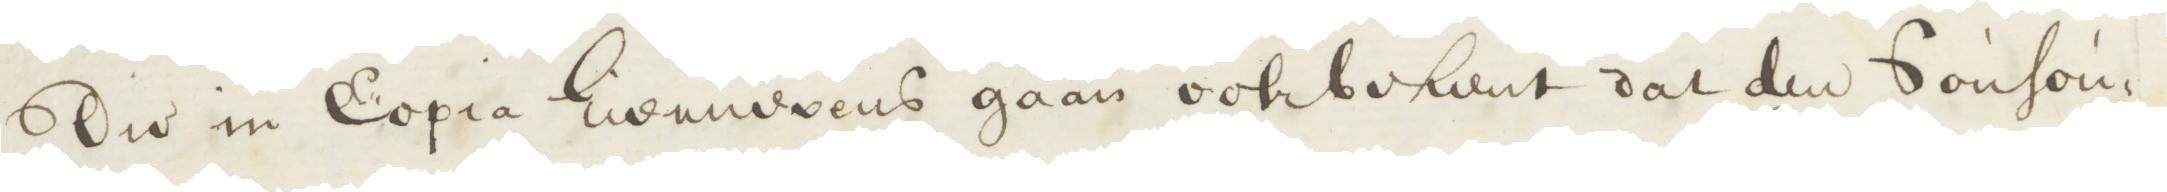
die in Copia hiernevens gaan ook bekent dat den Sousou„
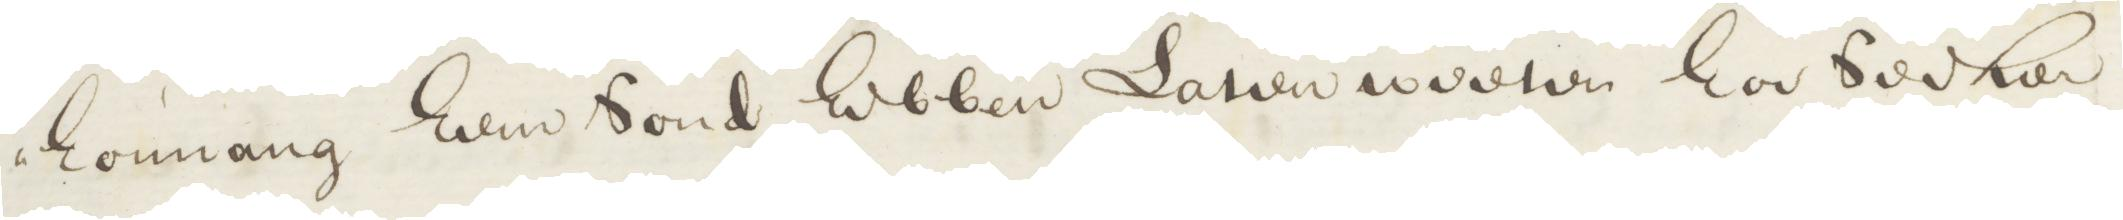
„hounang hem soude hebben Laten weeten hoe seeker
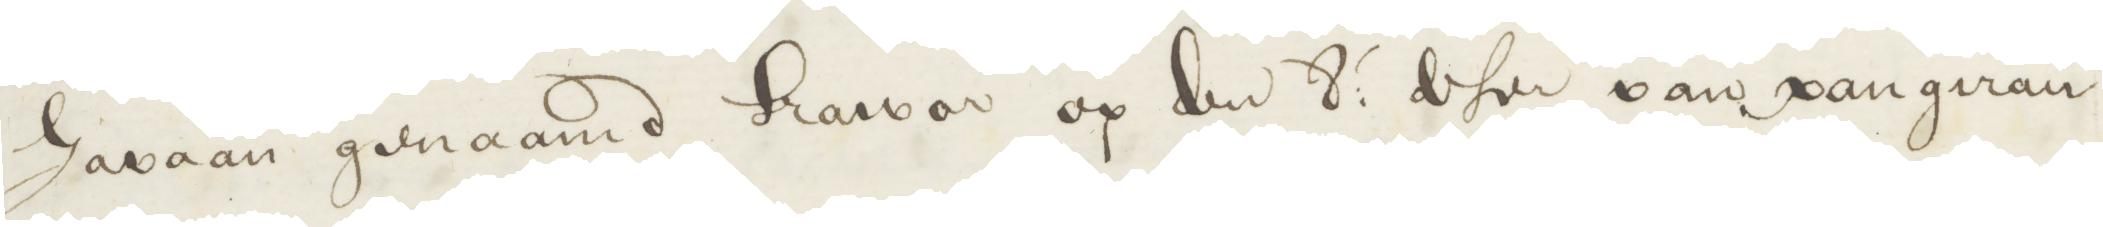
Javaan genaamd kawor op den 8: deser van pangiran
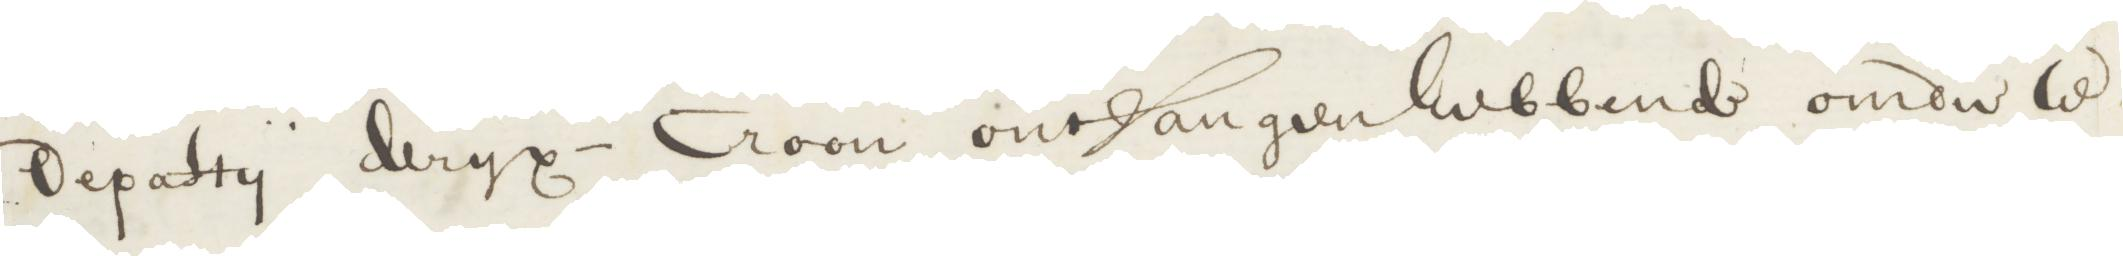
depattij de rijx-Croon ontfangen hebbende om die te
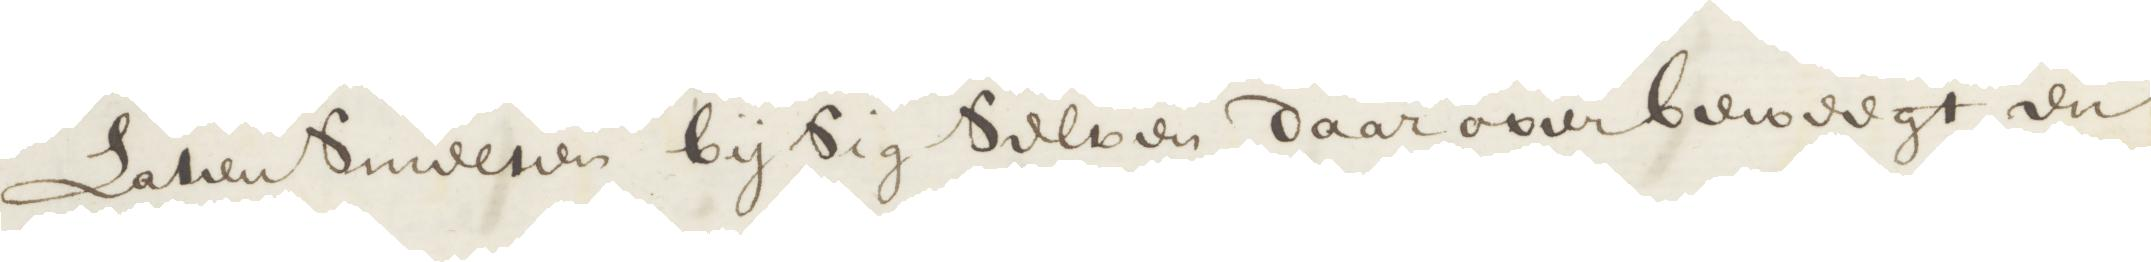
Laten Smelten bij Sig Selven daar over beweegt en
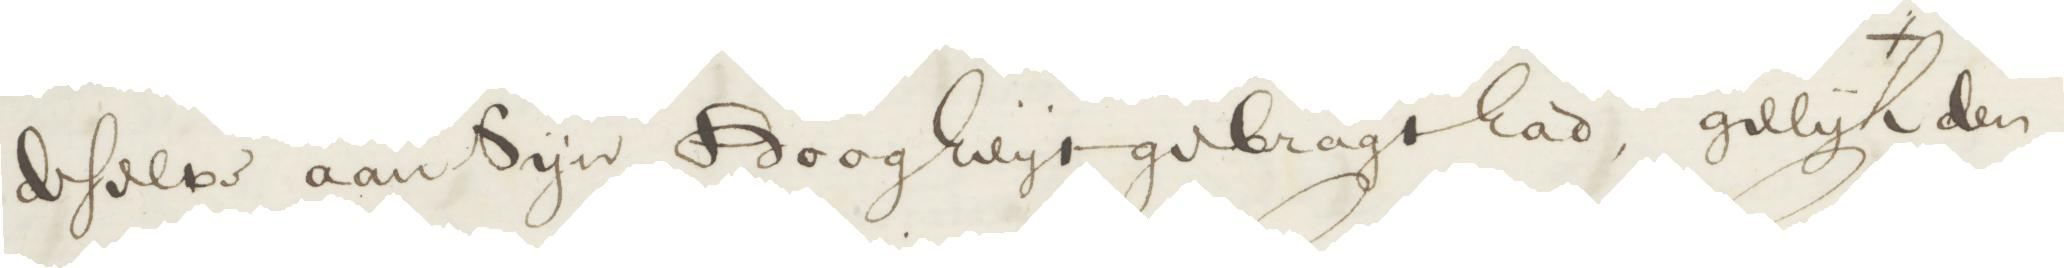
deselve aan Sijn Hoogheijt gebragt had, gelijk den
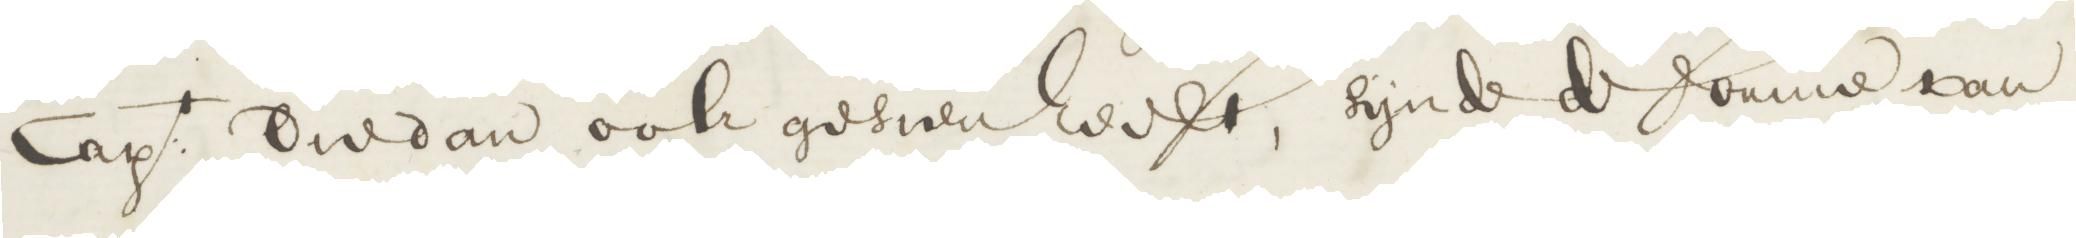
Cap:t die dan ook gesien heeft, sijnde de forme van
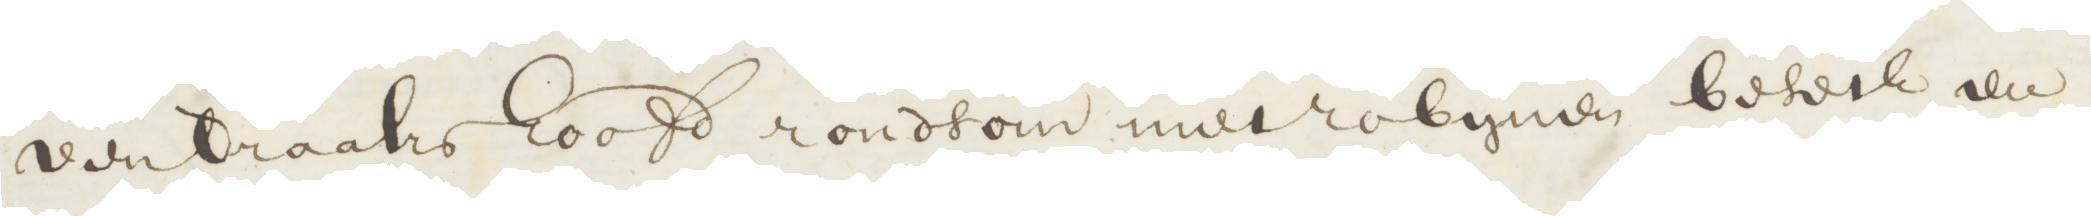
een draaks hoofd rondsom met robijnen beseth en
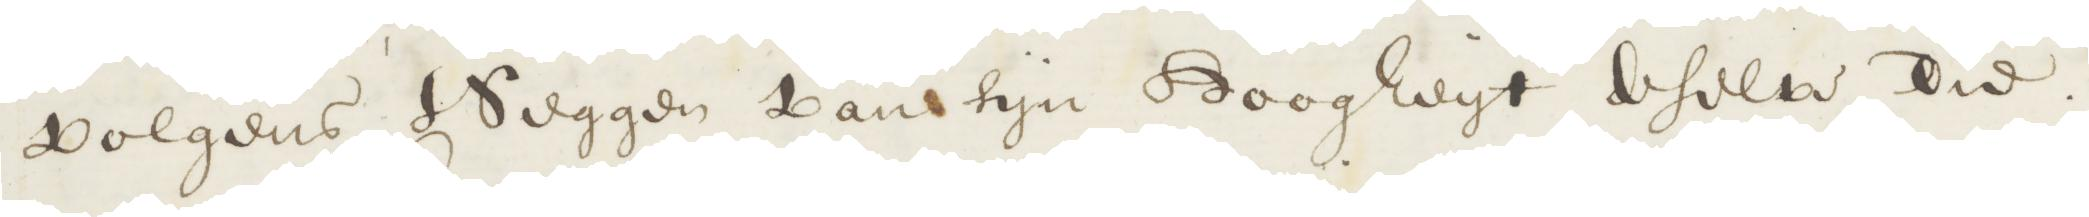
volgens 't Seggen van sijn Hoogheijt deselve die
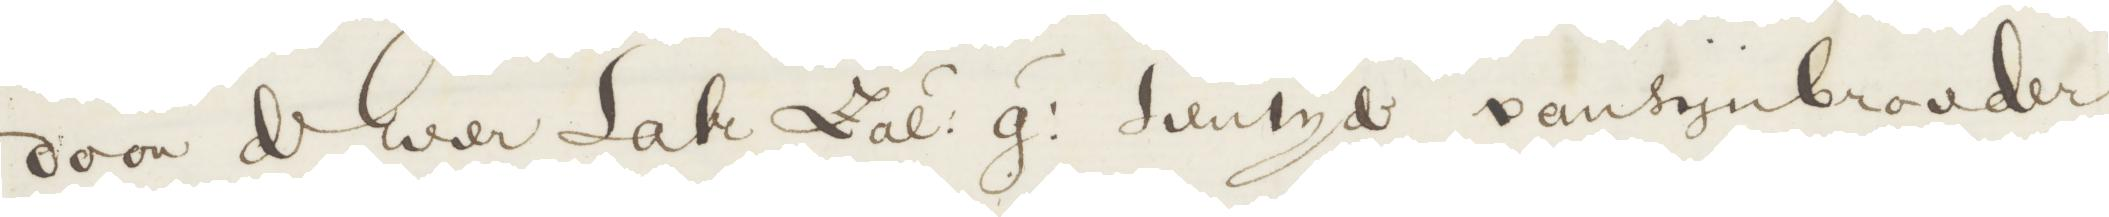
door de heer Lak Zal: g: tentijde van sijn broeder
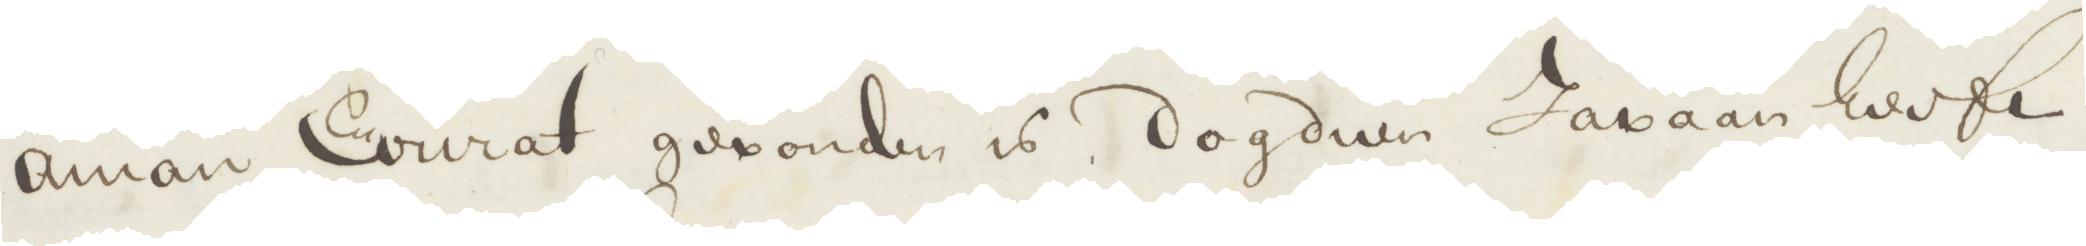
aman Courat gevonden is dog dien Javaan heeft
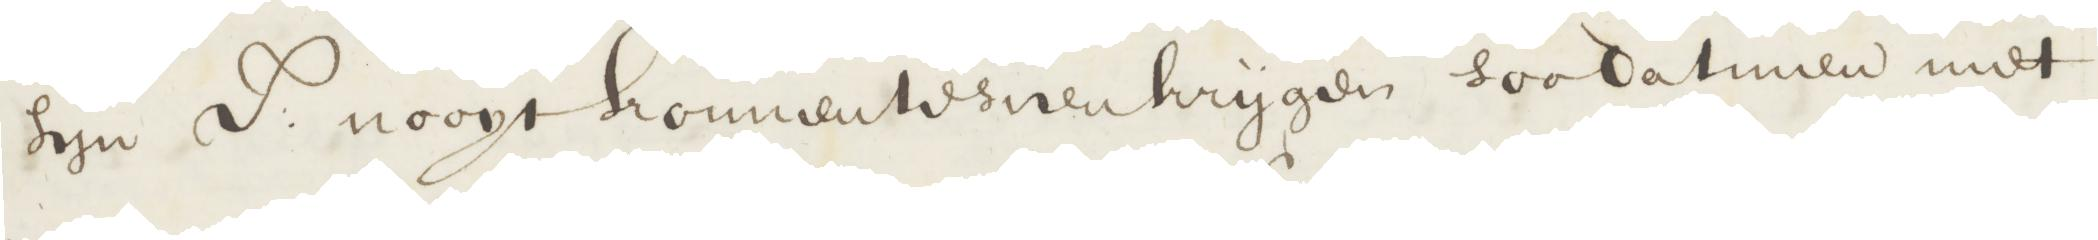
sijn E: nooijt konnen te sien krijgen soo dat men met
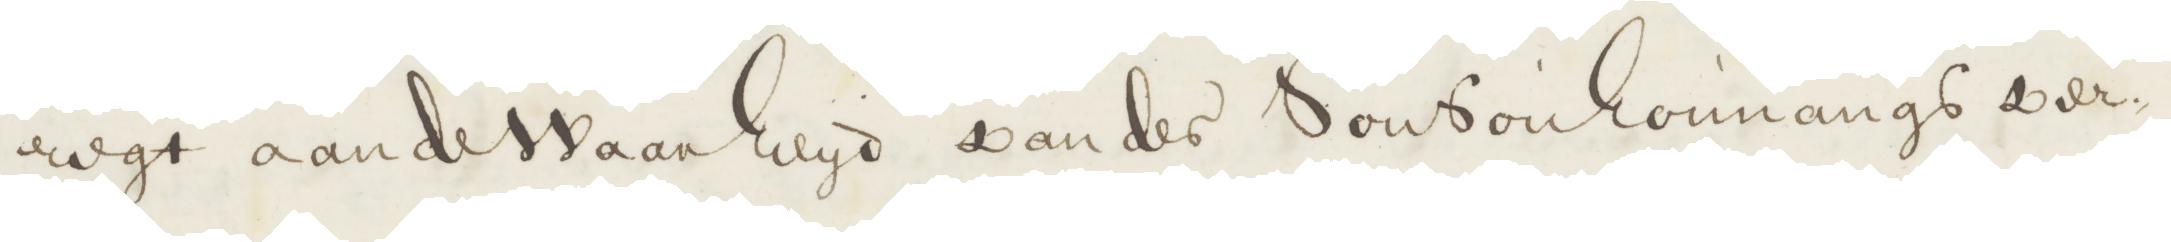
regt aan de Waarheijd van des Sousouhounangs ver„
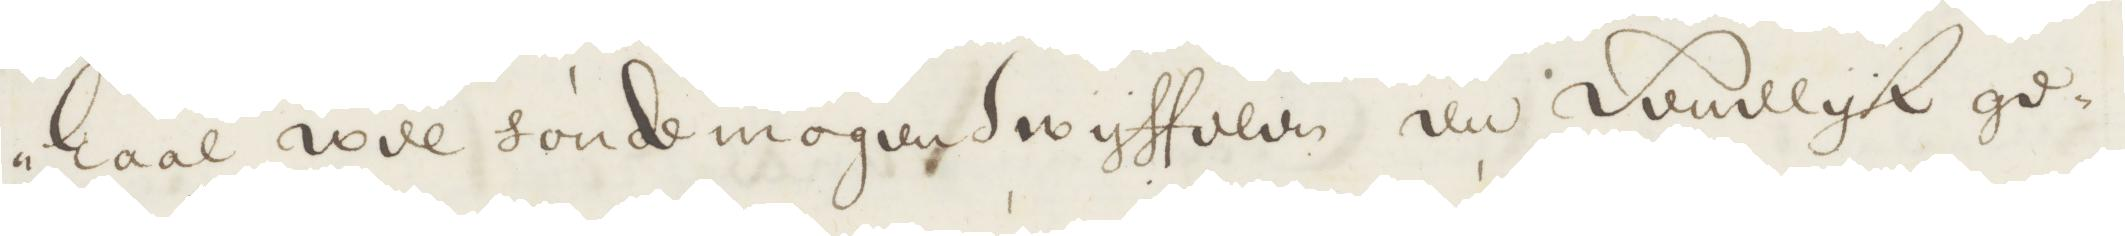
„haal wel soude mogen twijffelen en Eenelijk ge„
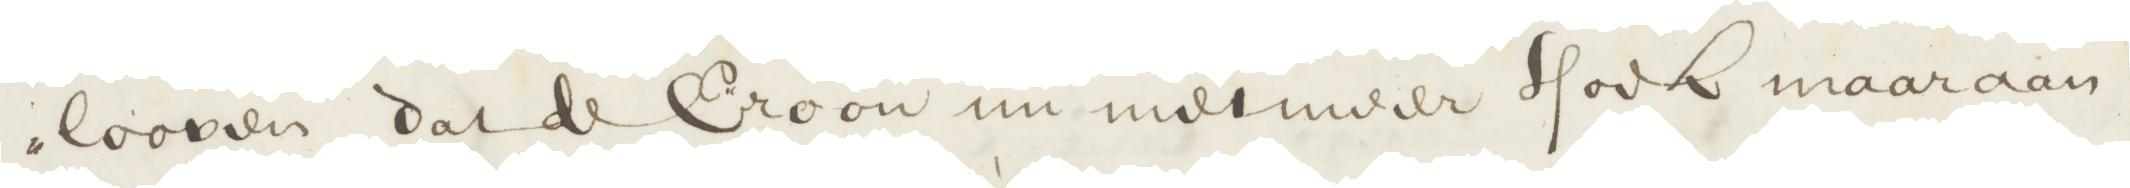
„looven dat de Croon nu niet meer 'tsoek maar aan
